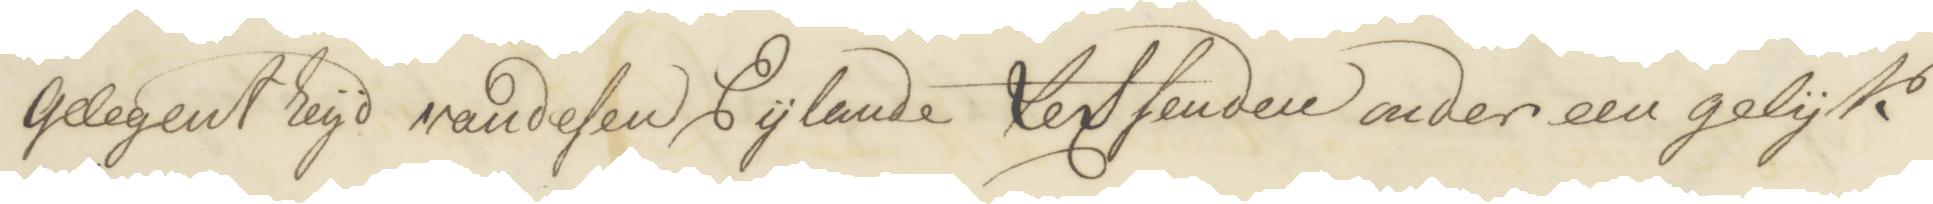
gelegentheijd van desen Eijlande teversenden onder een gelijk
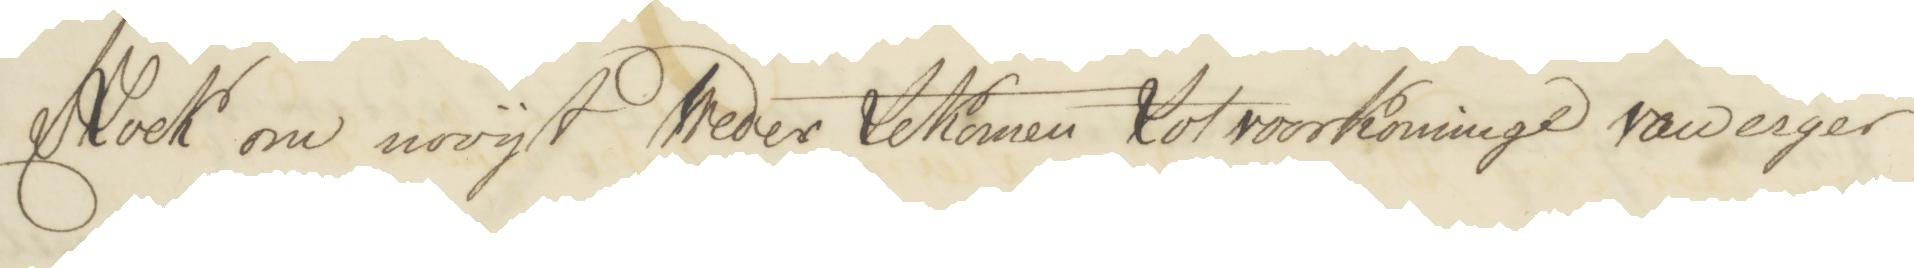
verzoek om novijt weder tekomen tot voorkominge van erger
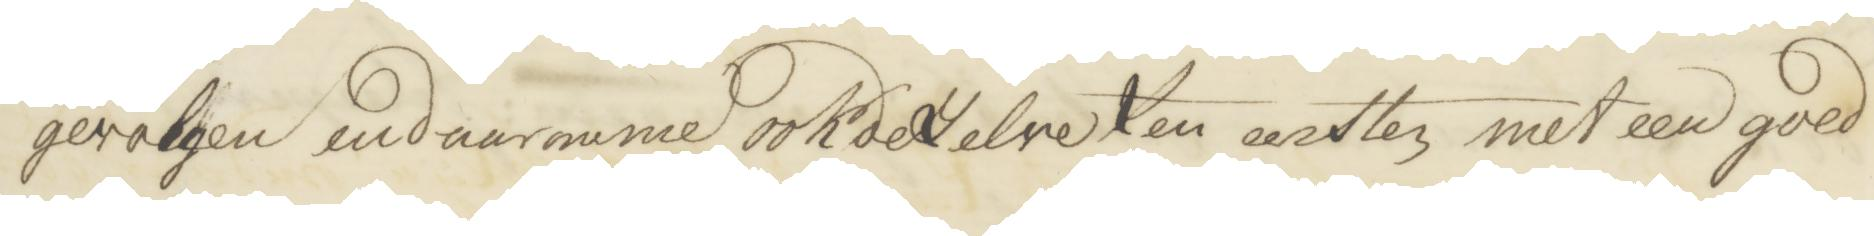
gevolgen en daaromme ook dezelve ten eersten met een goed
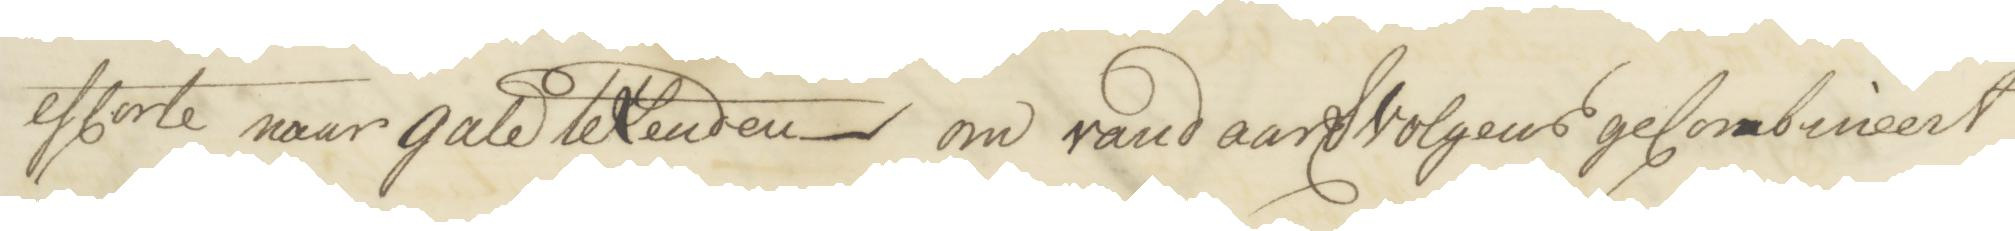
escorte naar gale tezenden om vandaarvervolgens gecombineert
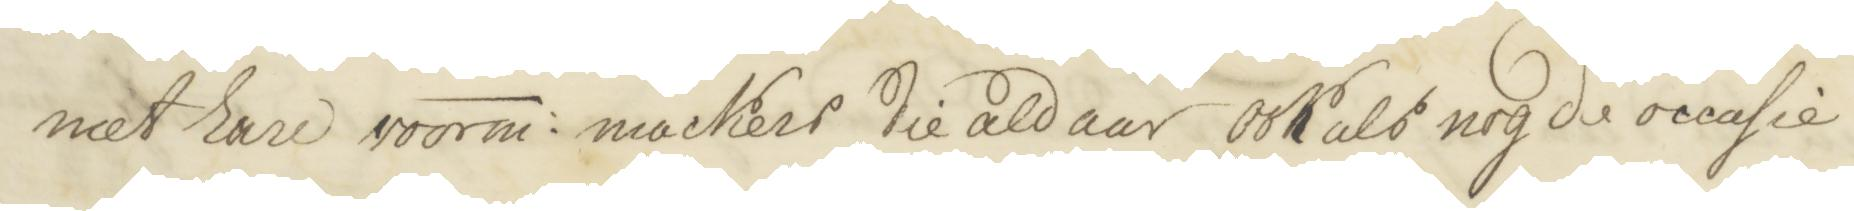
met hare voorm: mackers die aldaar ook als nog de occasie
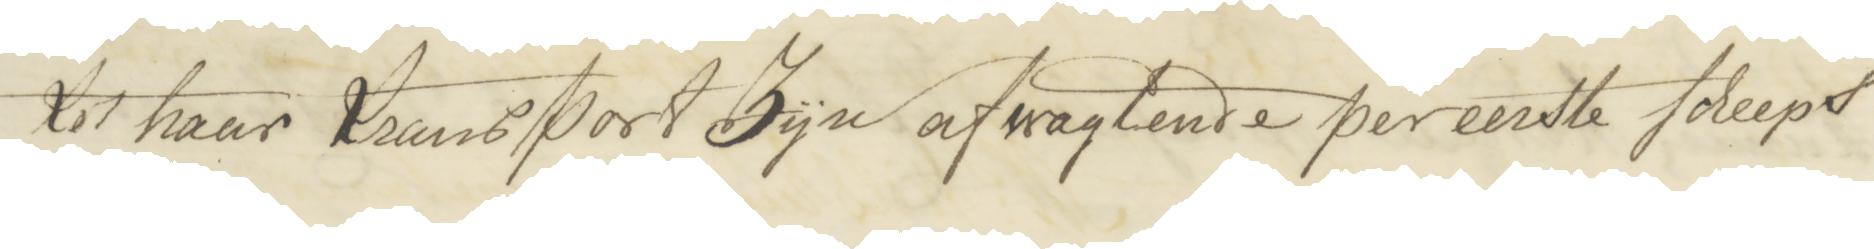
tot haar transport zijn afwagtende per eerste scheeps
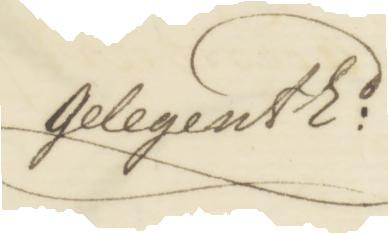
gelegenth:d
